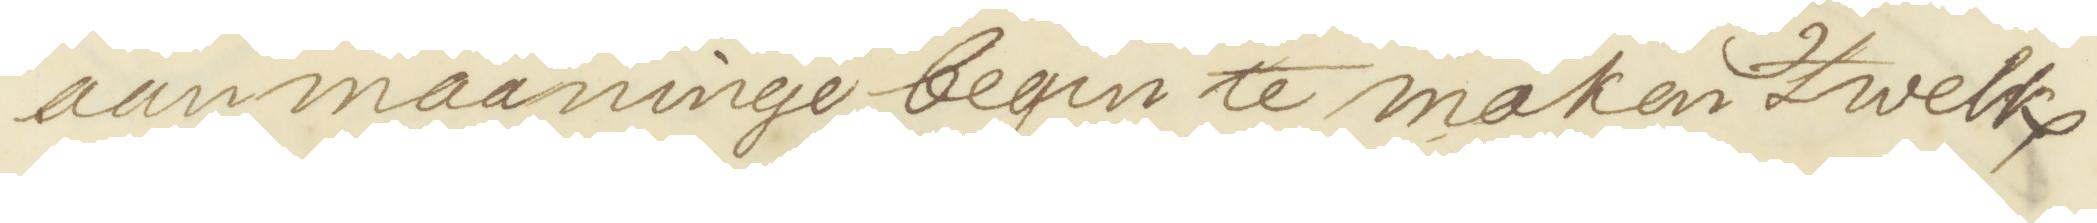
aanmaaninge begin te maken 'twelk
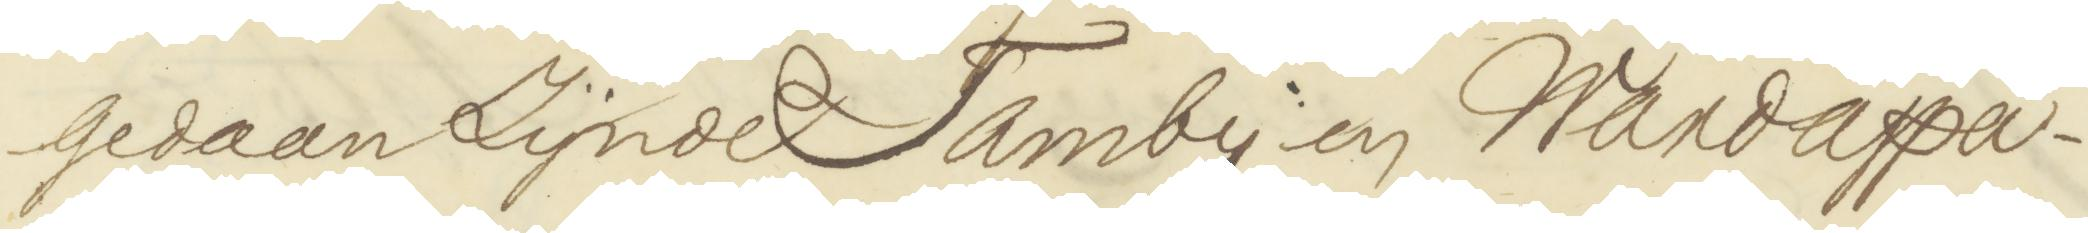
gedaan zijnde Tambij en Wardappa-
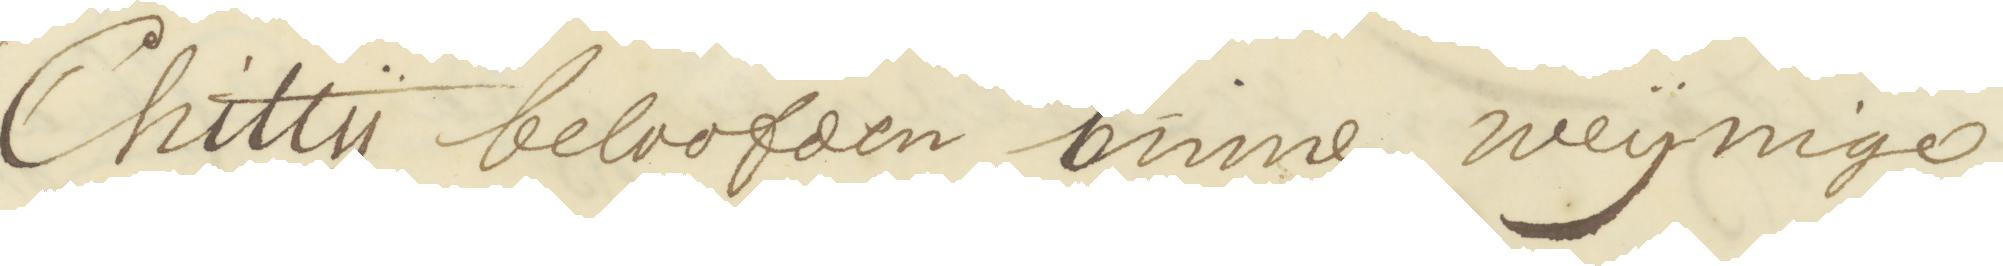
Chittij beloofden binnen weijnige
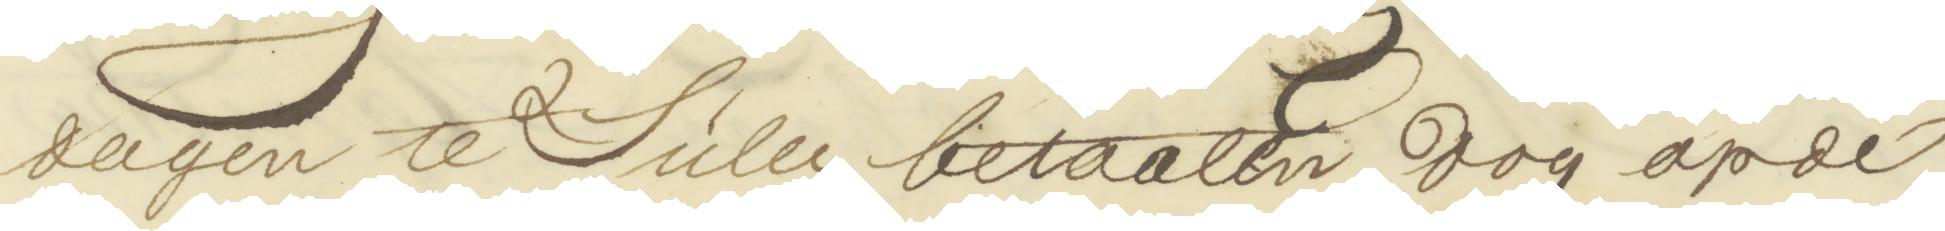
dagen te sullen betaalen dog opde
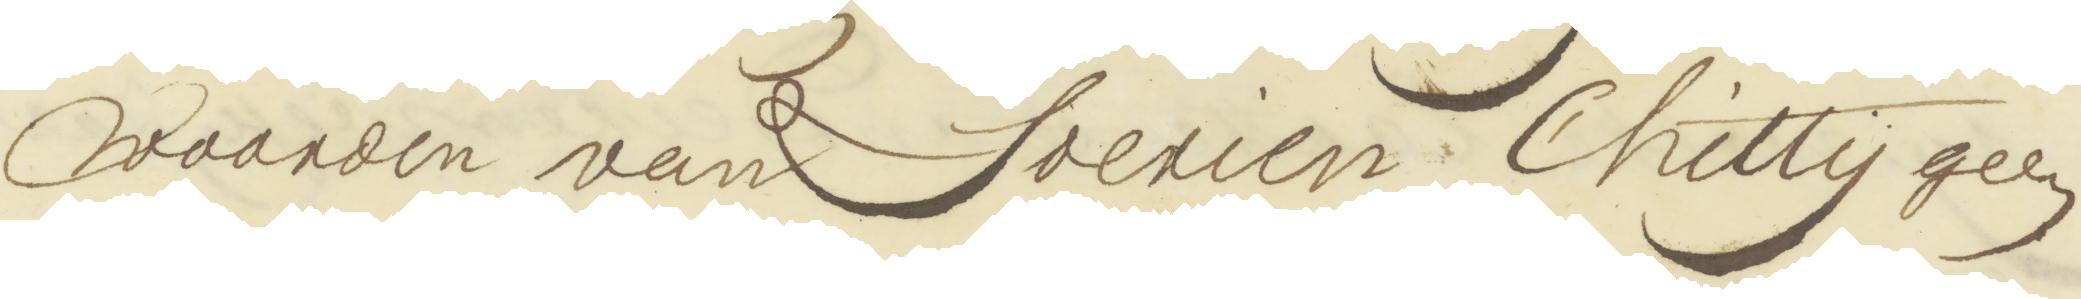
woorden van Soerien Chittij geen
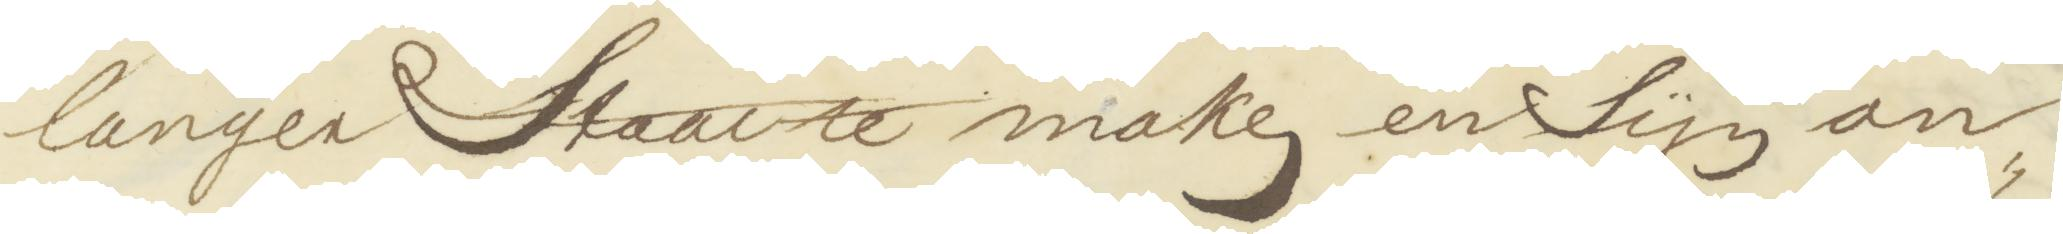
langer Staat te maken en sijn on„
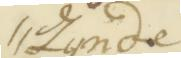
„ zynde
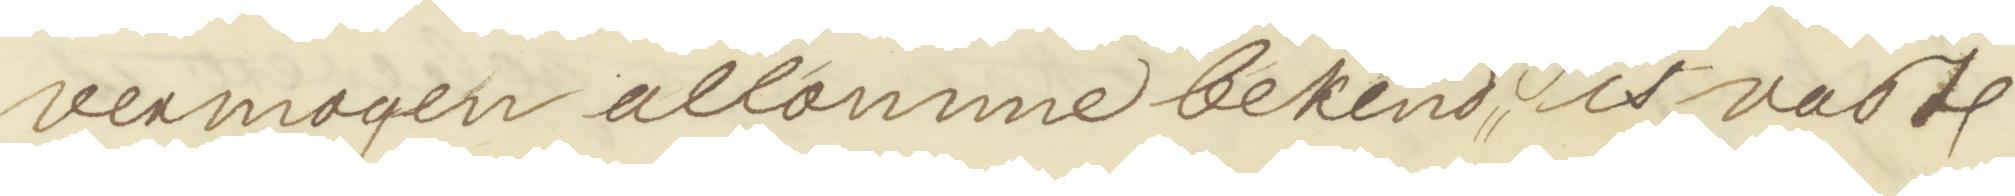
vermogen allomme bekend „ is vast
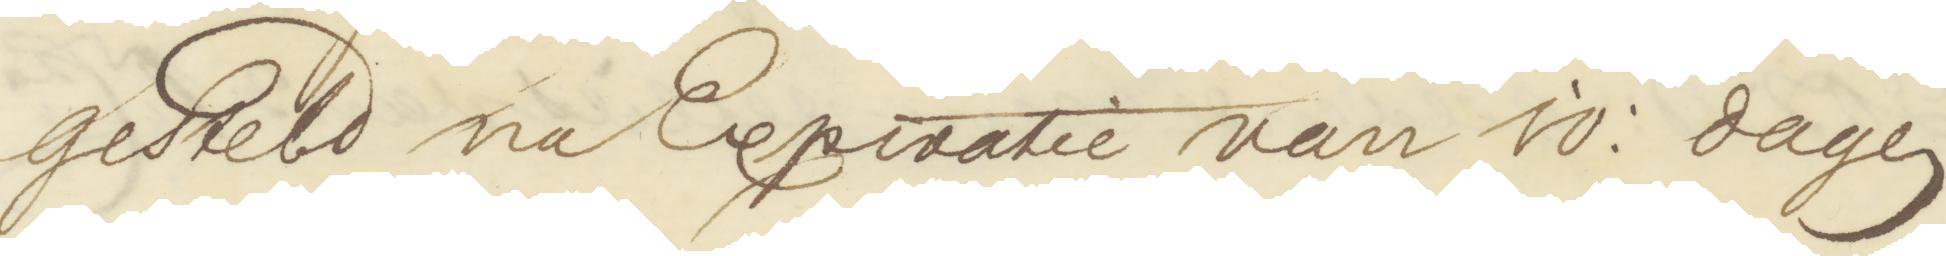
gesteld na Expiratie van 10: dagen
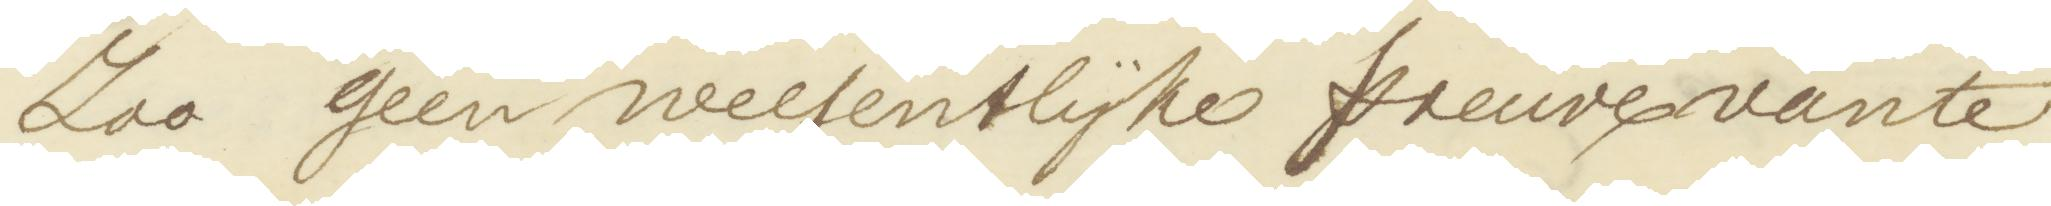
zoo geen weesentlijke preuve vante
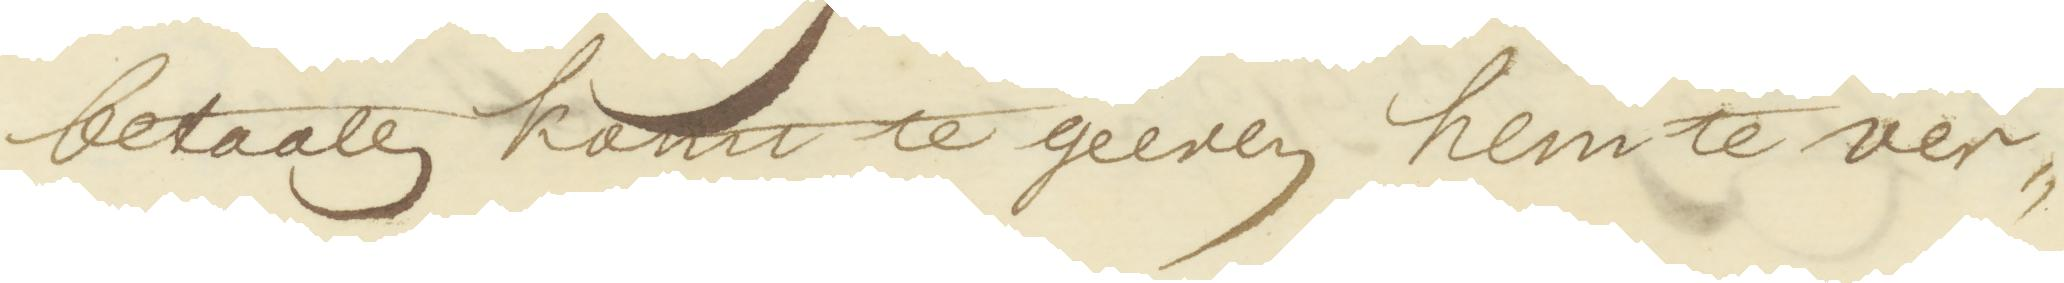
betaalen komt te geeven hem te ver„
